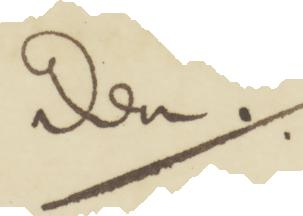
Een.
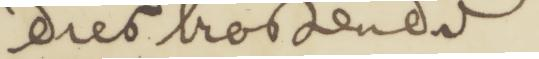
dies kostende
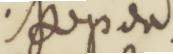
peper.
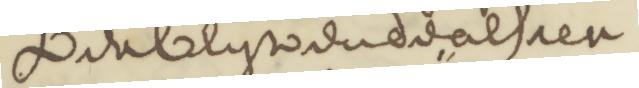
verblijvende „ alhier
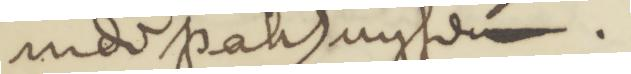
inde pakhuijsen.
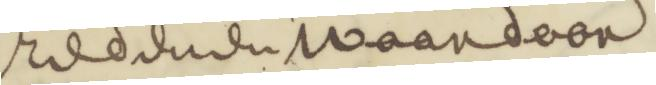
redenen waardoor
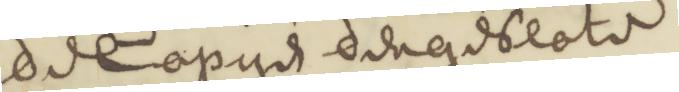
de Copijen dergeslote
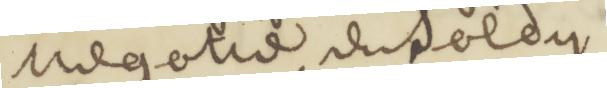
negotie, en soldij
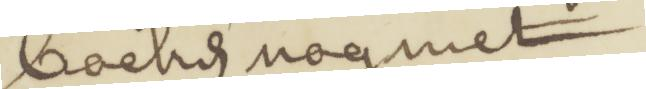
boeken nog niet
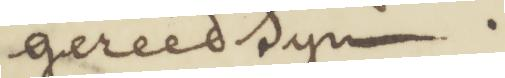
gereed sijn.
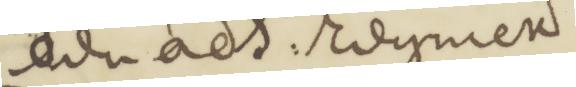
den ads:t reijnier
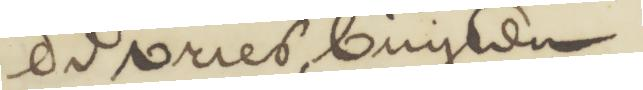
de vries, buijten
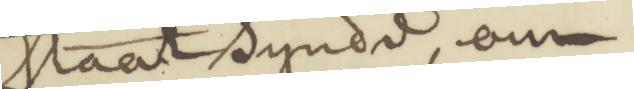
staat sijnde, om
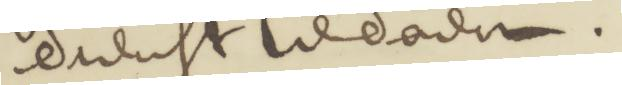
dienst tedoen.
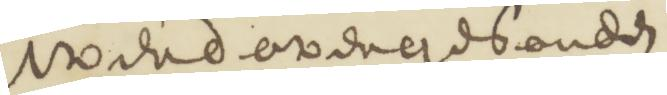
werd overgesonden
